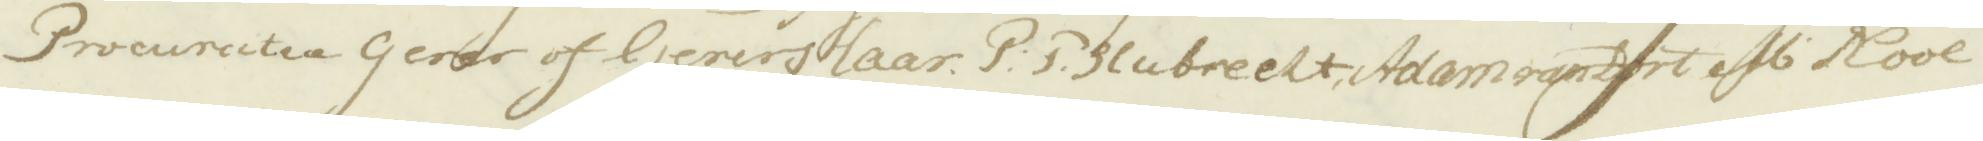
Procuratie Gever of Gevers laar. P: F. Hubrecht, Adam van Dort M Kool
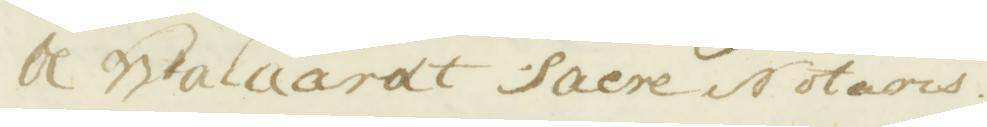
de Walaardt Sacre Notaris.
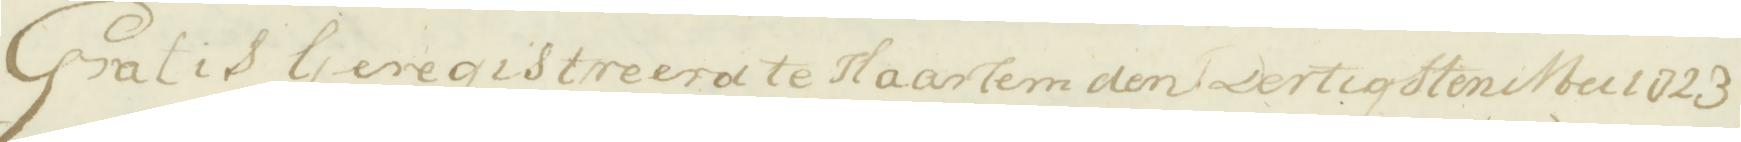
Gratis Geregistreerd te Haarlem den Dertigsten Mei 1823
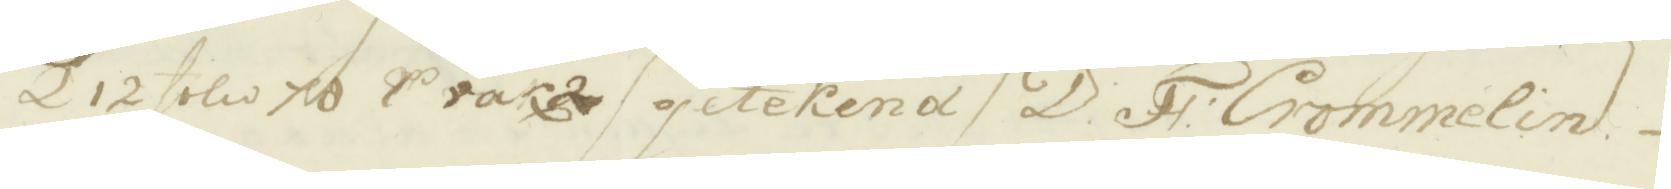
212 folio 78 Vo vak 2 / getekend / D: F: Crommelin.
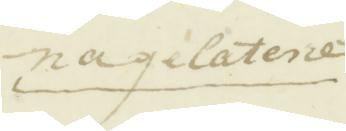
nagelatene
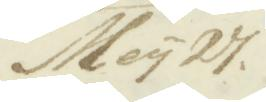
Meij 27.
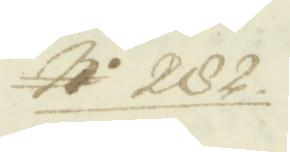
No 282.
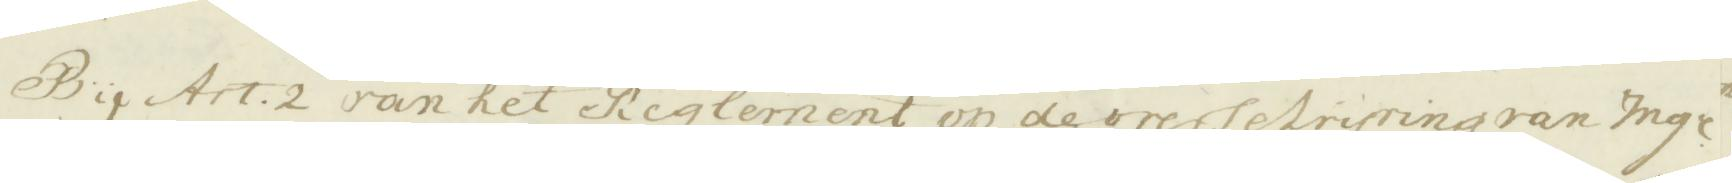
Bij Art. 2 van het Reglement op de overschrijving van Inge
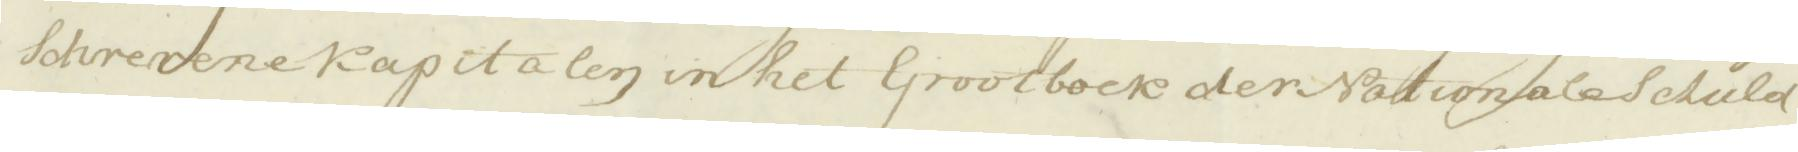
schrevene kapitalen in het Grootboek der Nationale Schuld
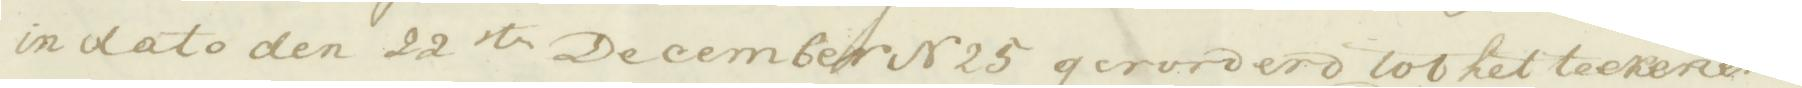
in dato den 22ste December N25 gevorderd tot het teekenen
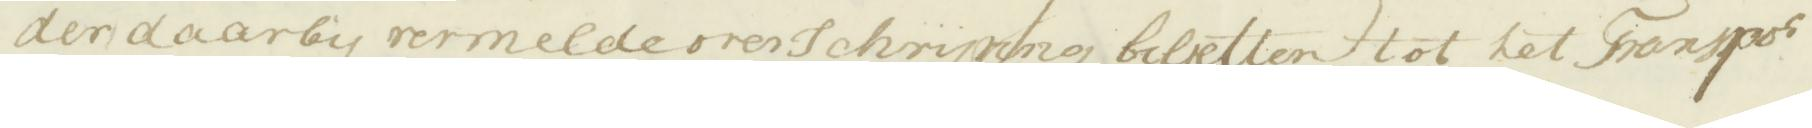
der daarby vermelde overschrijving biljetten: tot het Transpor
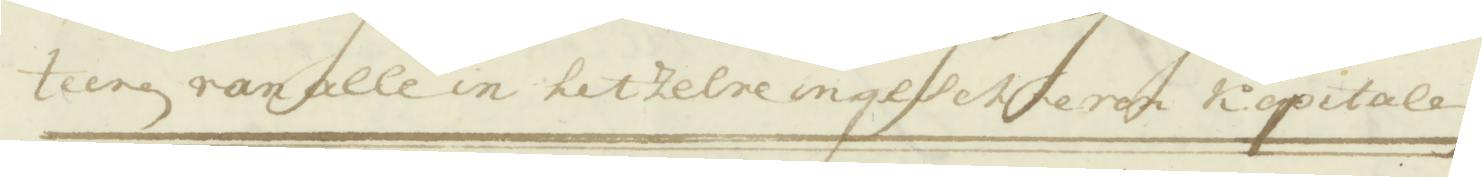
teeren van alle in het zelve ingeschreven kapitalen
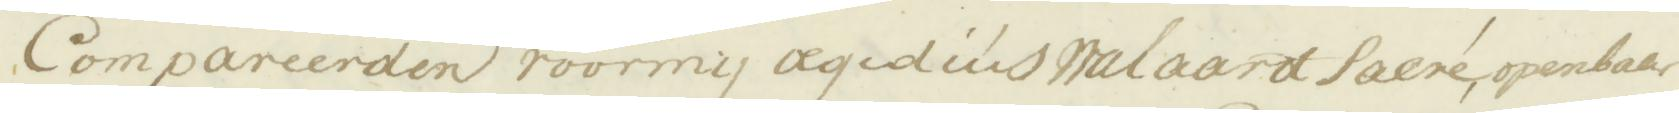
Compareerden voor mij aegidius walaardt Sacré, openbaar
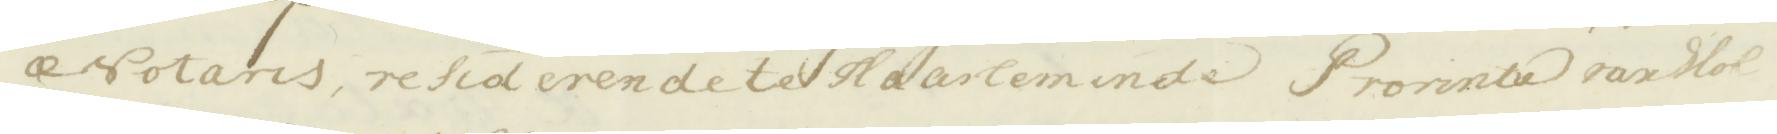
Notaris, residerende te Haarlem in de Provintie van Hol
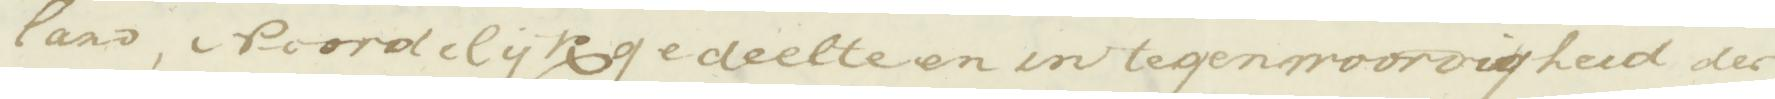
land, Noordelijk gedeelte en in tegenwoordigheid der
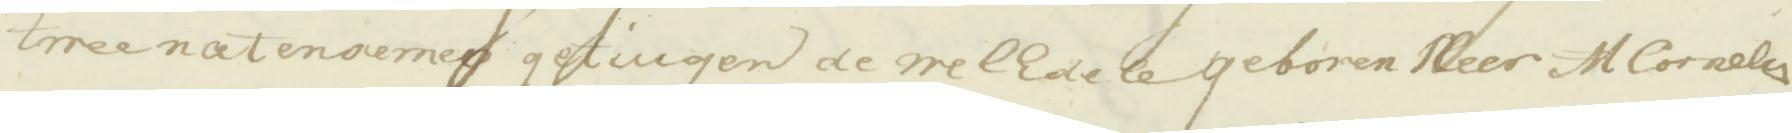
twee natenoemen getuigen de wel Edele geboren Heer M Cornelis
